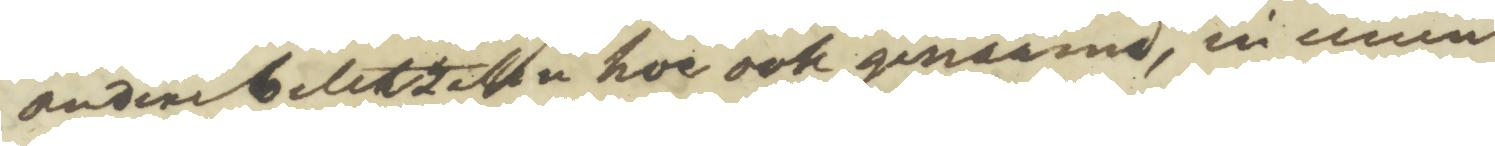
andere beletzelen hoe ook genaamd, en eenen
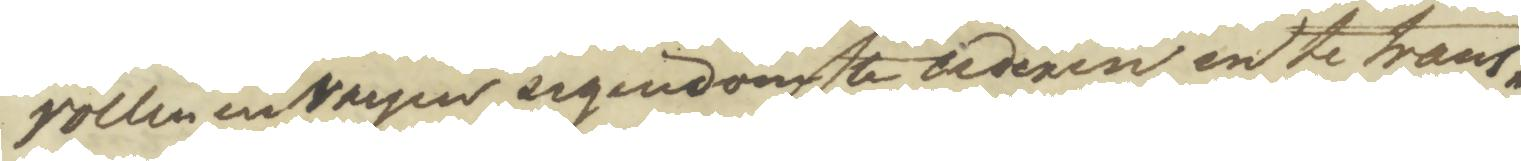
vollen en vryen eigendom te cederen en te trans„
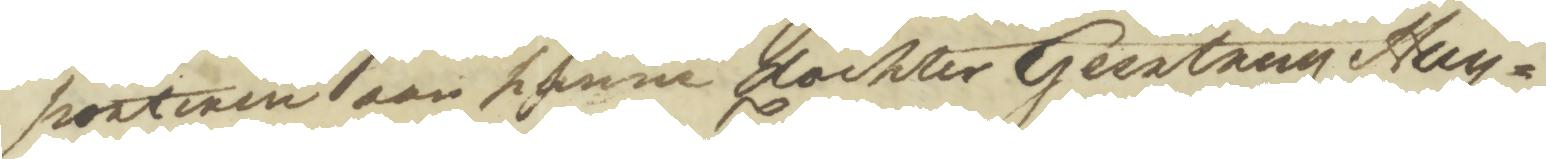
porteren aan hunne dochter Geertruy Huy=
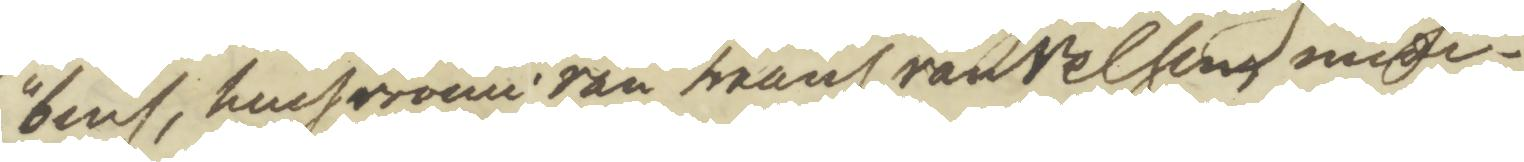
„bers, huisvrouw van Frans van Velsen, mede
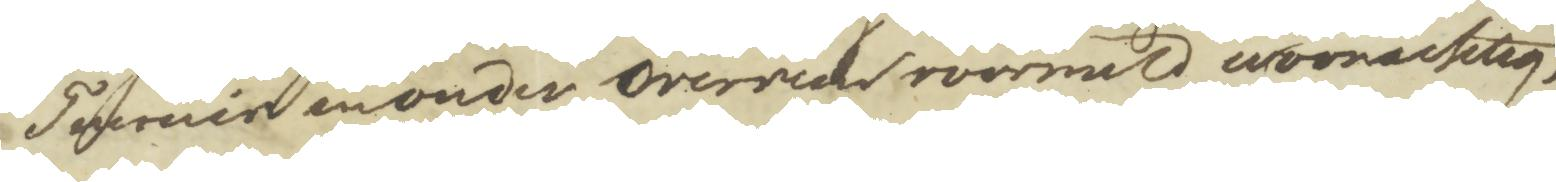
Tuinder en onder Overveen voormeld woonachtig,
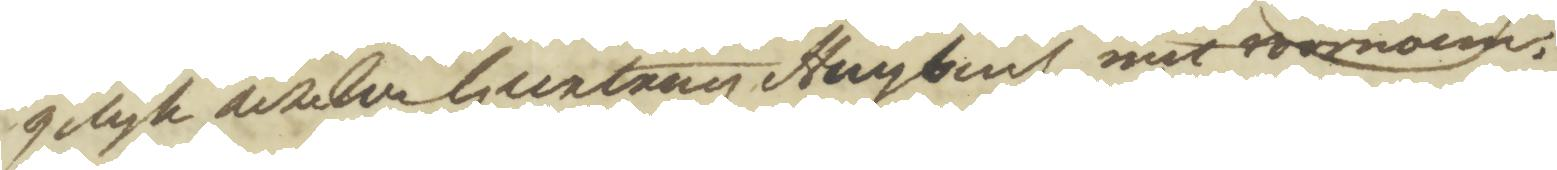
gelyk dezelve Gertruy Huybers, met voornoem„
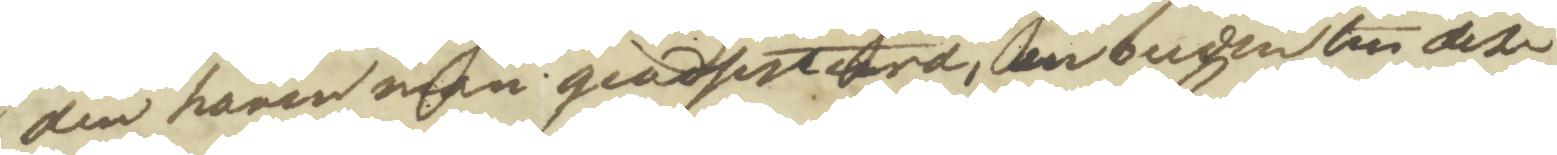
„den haren man geadsisteerd, en beiden ten deze
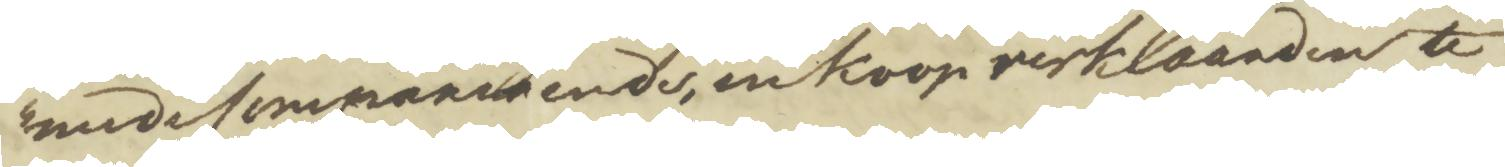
mede Comparerende, in koop verklaarden te
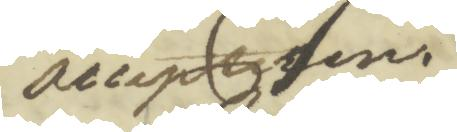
accepteren,
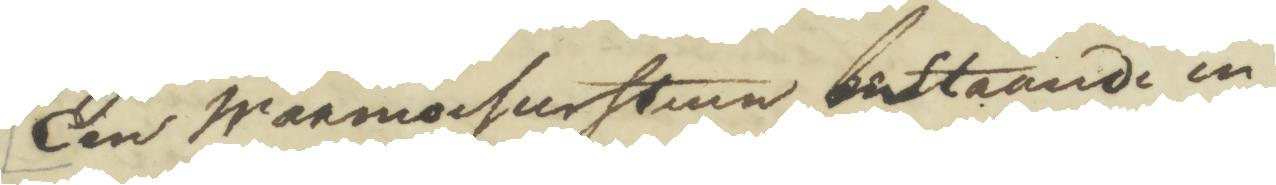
Een warmoeseerstuin bestaande in
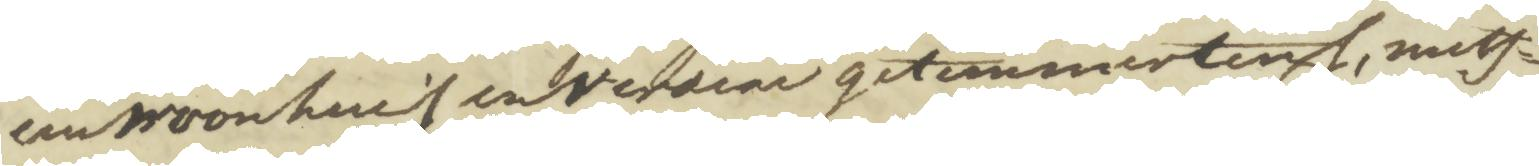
een woonhuis en verdere getimmertens, mits=
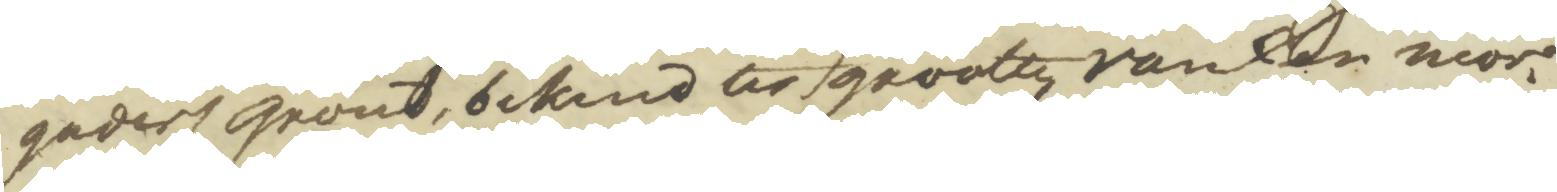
gaders grond, bekend ter grooten van Een mor„
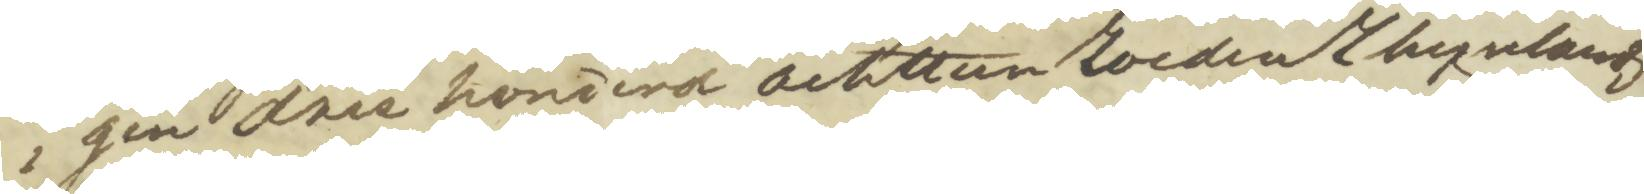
„gen drie honderd achttien roeden Rhynlanden
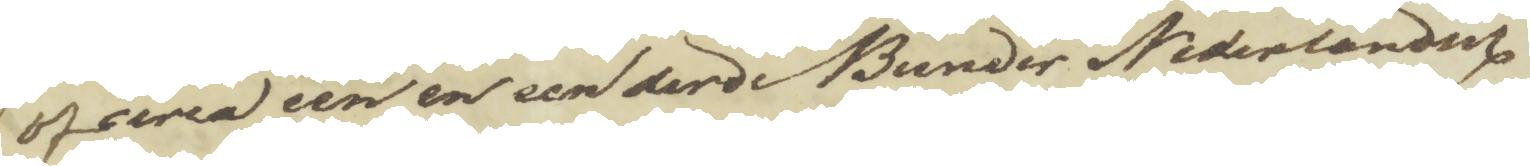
of eeven een en een derde Bunder Nedertandsch
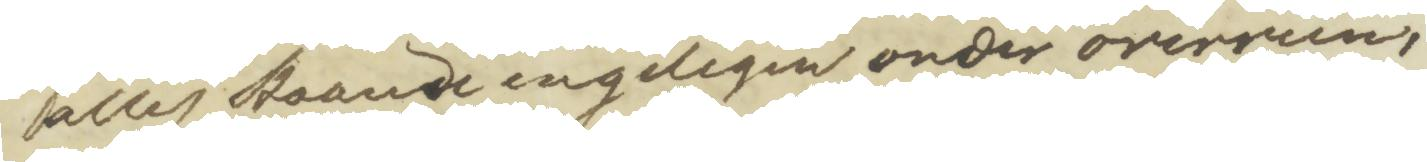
alles staande en gelegen onder overveen,
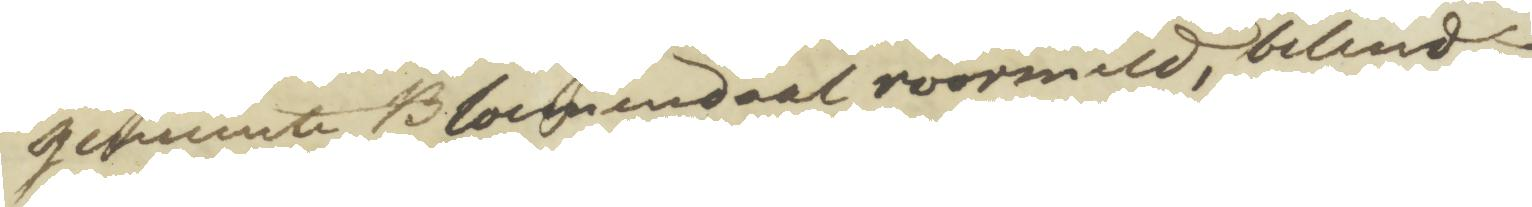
gemeente Bloemendaal voormeld, belend
